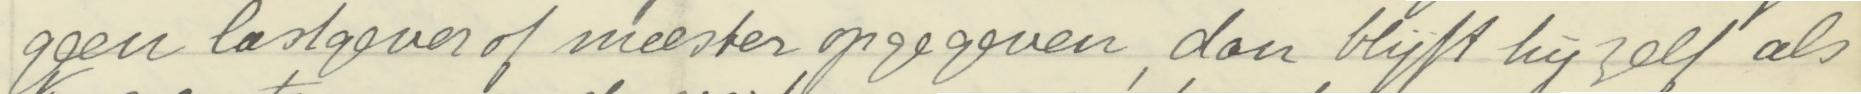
geen lastgever of meester opgegeven, dan blijft hijzelf als
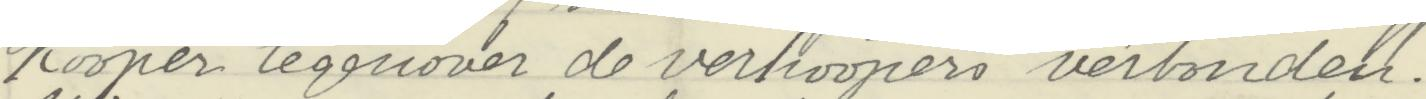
kooper tegenover de verkoopers verbonden.
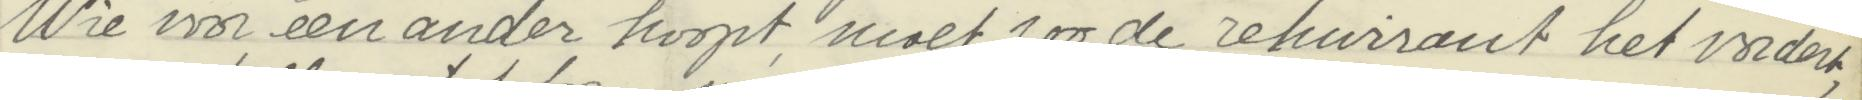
Wie voor een ander koopt, moet zoo de rekwirant het vordert,
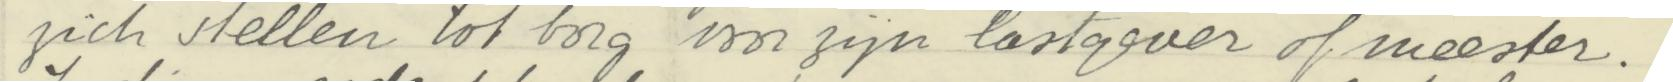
zich stellen tot borg voor zijn lastgever of meester.
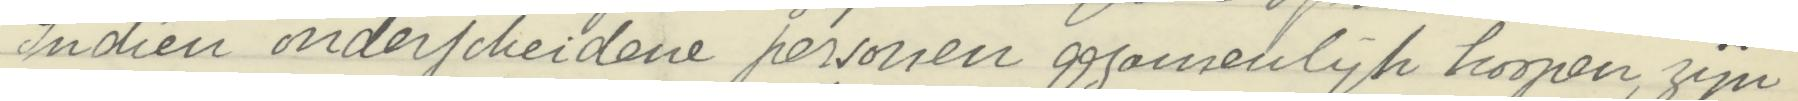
Indien onderscheidene personen gezamenlijk koopen, zijn
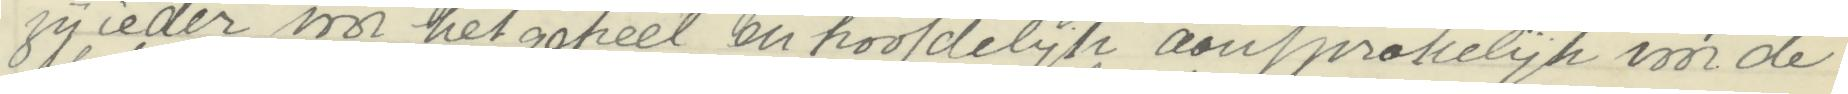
zij ieder voor het geheel en hoofdelijk aansprakelijk voor de
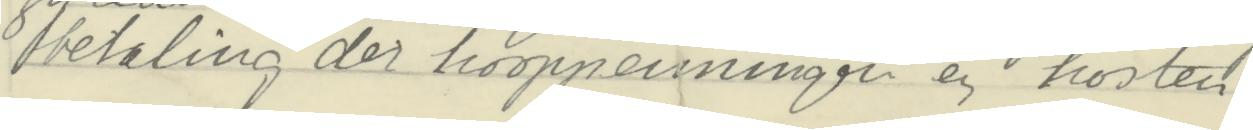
betaling der kooppenningen en kosten
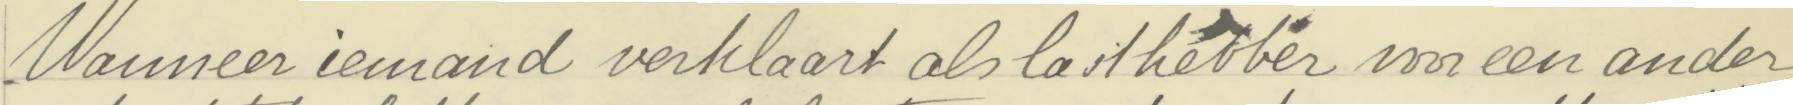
Wanneer iemand verklaart als lasthebber voor een ander
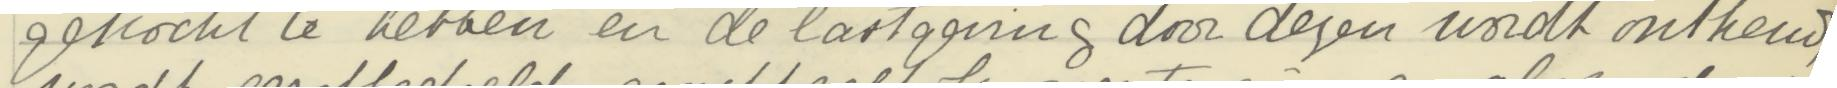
gekocht te hebben en de lastgeving door dezen wordt ontkend,
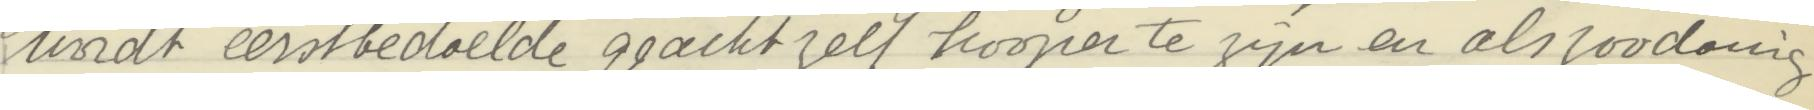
wordt eerstbedoelde geacht zelf kooper te zijn en als zoodanig
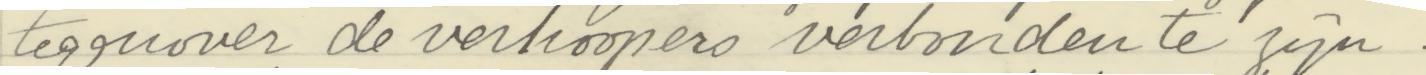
tegenover de verkoopers verbonden te zijn
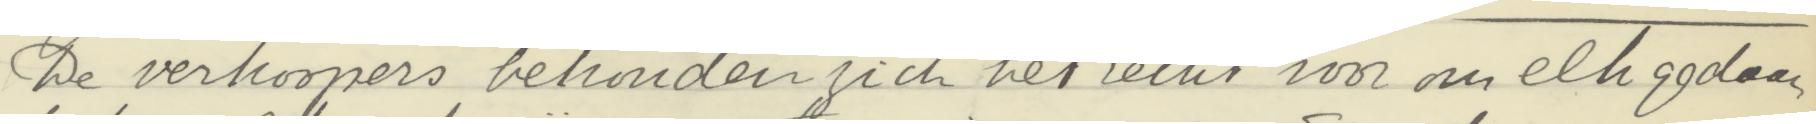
De verkoopers behouden zich het recht voor om elk gedaan
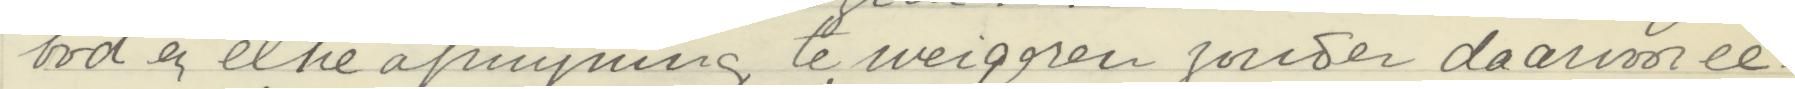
bod en elke afmijning te weigeren zonder daarvoor ee
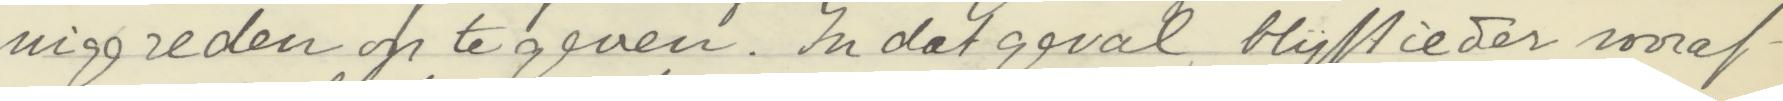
nige reden op te geven. In dat geval, blijft ieder vooraf
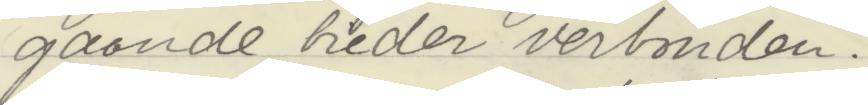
gaande bieder verbonden
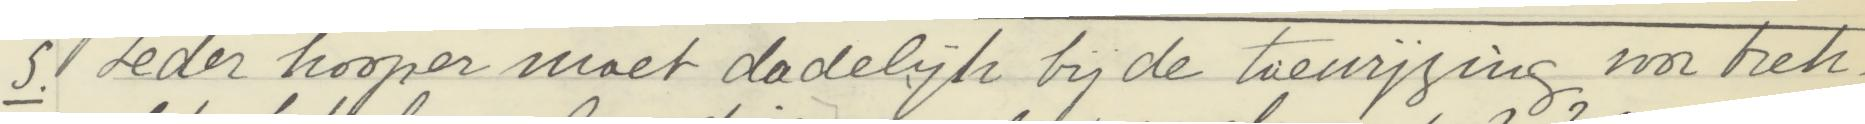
5. Ieder kooper moet dadelijk bij de toewijzing voor trek
